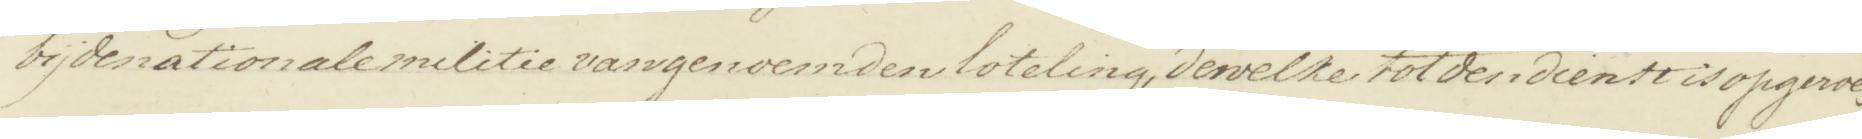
bij denationale militie van genoemden loteling, dewelke tot den dienst is opgeroe„
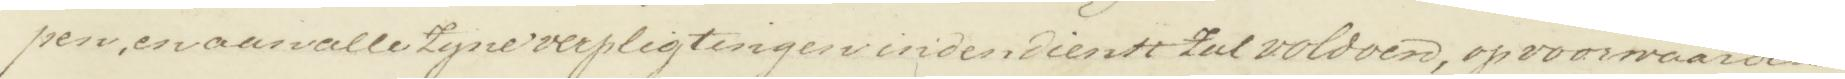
pen, en aan alle Zijne verpligtingen in den dienst Zal voldoen, op voorwaarden
